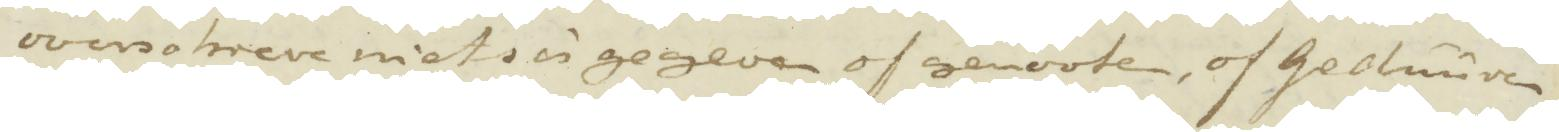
voorschreve niets is gegeven of genooten, of Geduuren
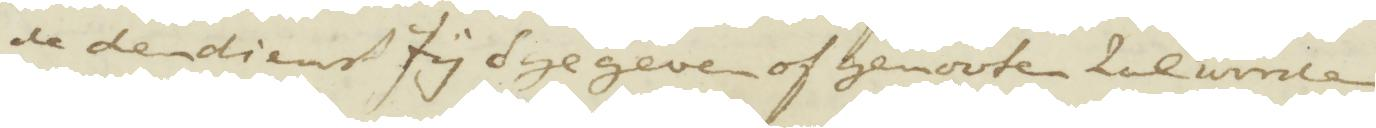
de den dienst tijd gegeven of genooten zal worden
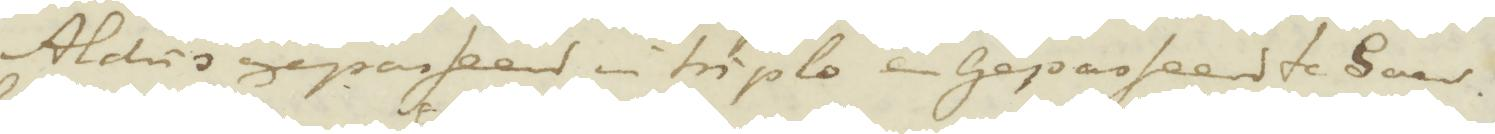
Aldus gepasseerd in triplo en Gepasseerd te haar
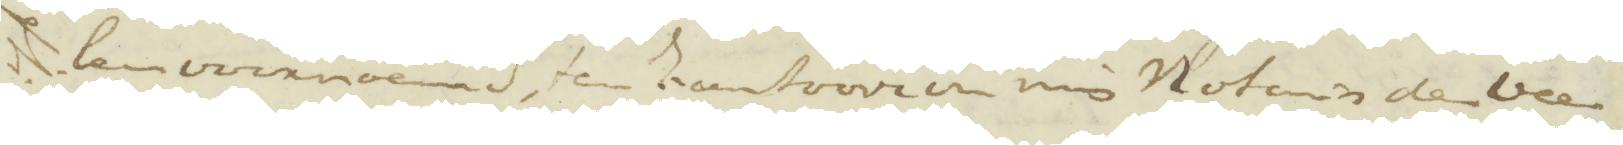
lem voornoemd, ten kantooren mij Notaris de veer
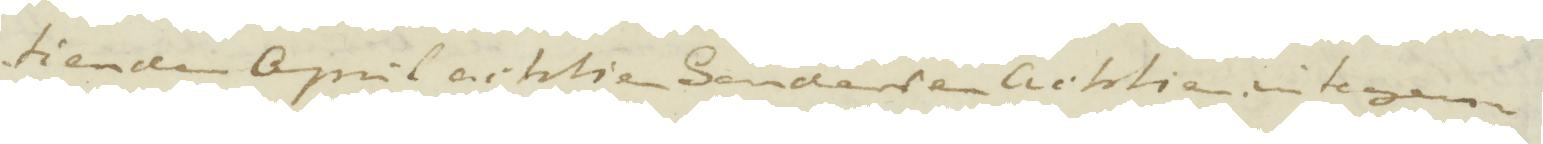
tiende April achtien honderd en Achtien, in tegen
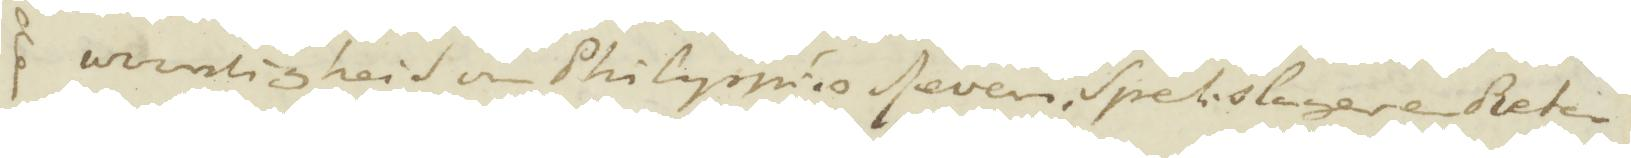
woordigheid van Philipus Revers, spekslager en Pieter
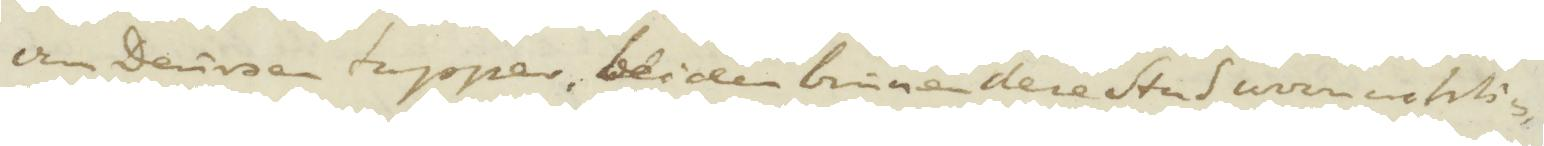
van Deursen tapper, beiden binnen deze stad woonachtig
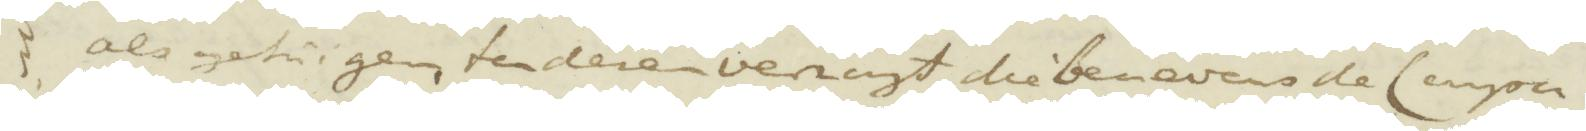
als getuigen, ten dezen verzogt, die benevens de Compar
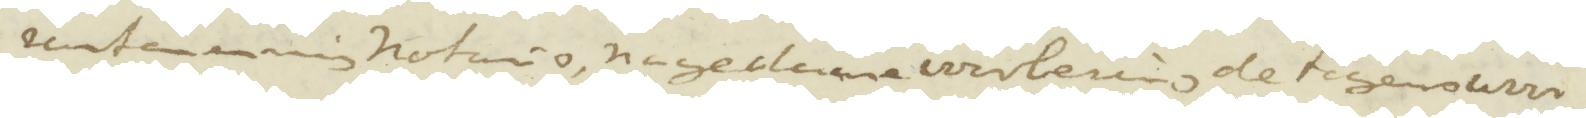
ranten en mij Notaris, na gedeane voorlezing de tegenswoor
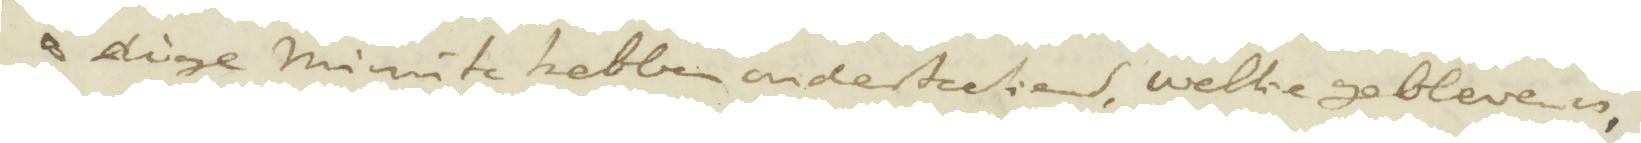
dige minute hebben ondertekend, welke gebleven is,
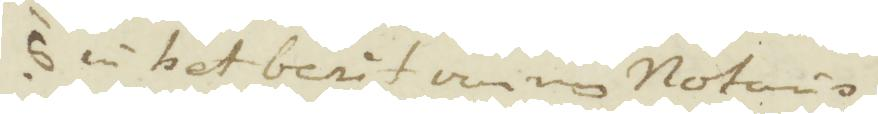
in het bezit van my Notaris.
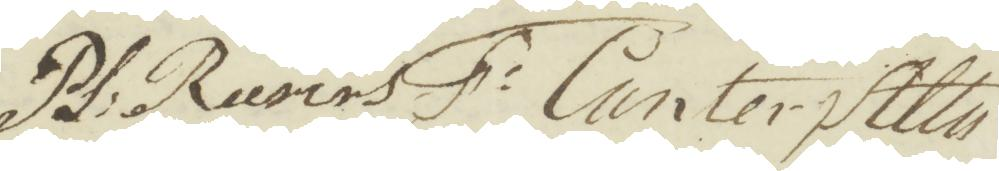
Ps: Reevers F: Canter Alta
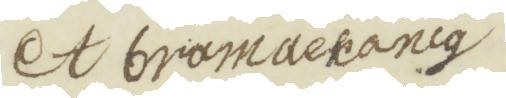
Abram de konig
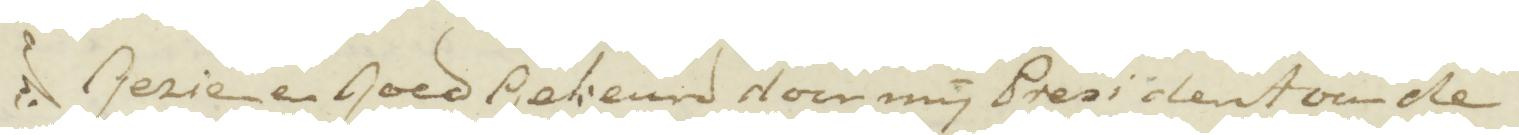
Gezien en Goed Gekeurd door mij President van de
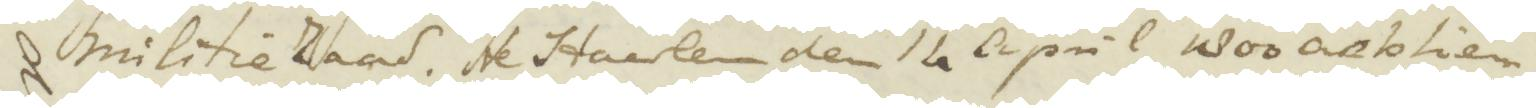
militie raad, te Haarlem den 14 April 1800 achtien
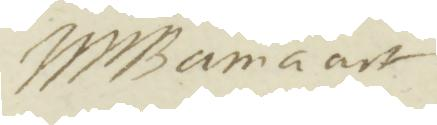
WBamaart
